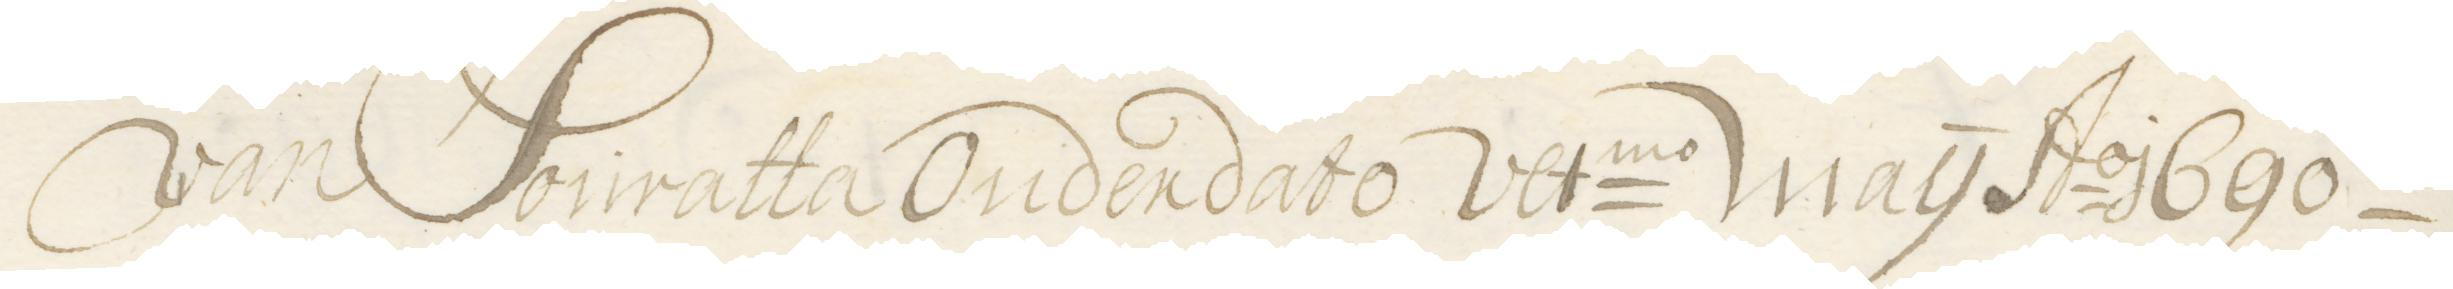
van Souratta Onder dato vlt=mo Maij A=o 1690 —
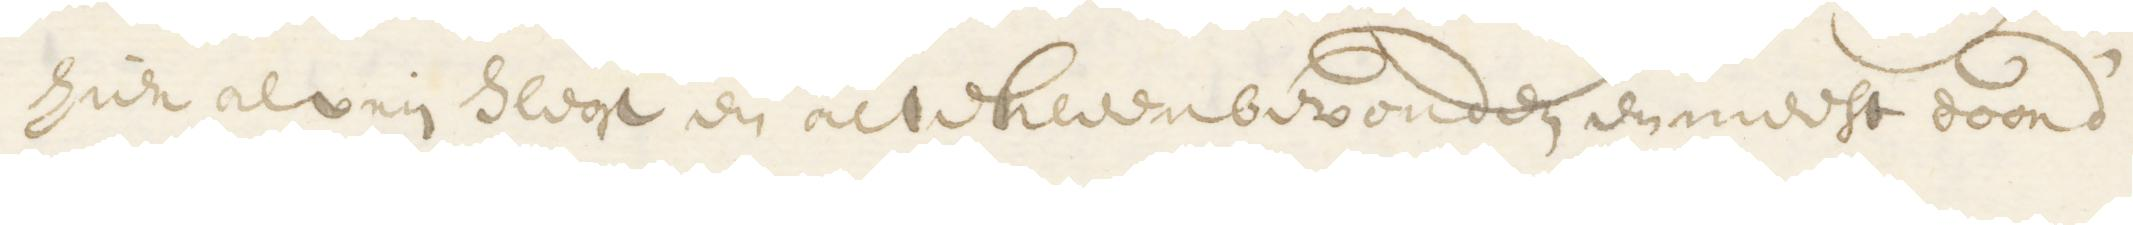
hier alvrij slegt en alte kleen bevonden en meest door d’
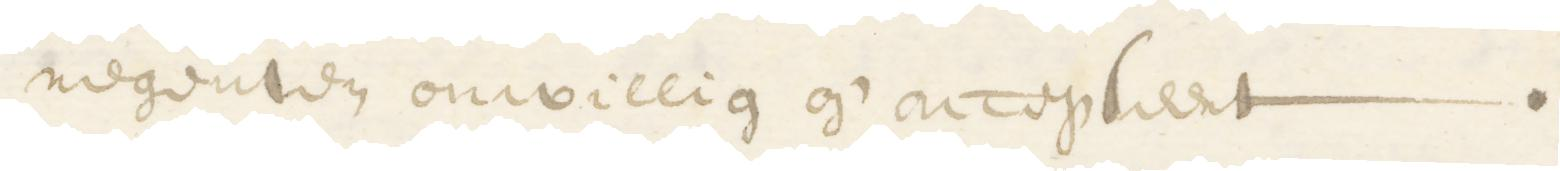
regenten onwillig g’ accepteert.
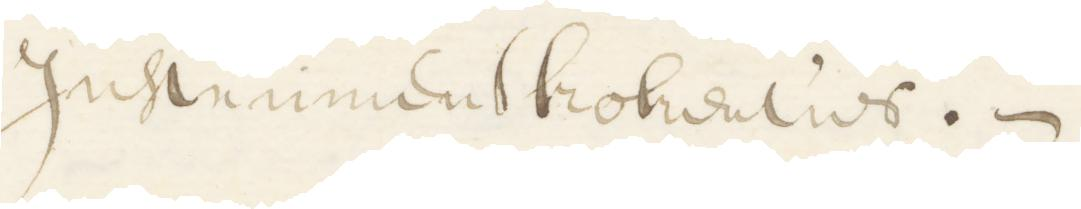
Jnstrument kokerties. —
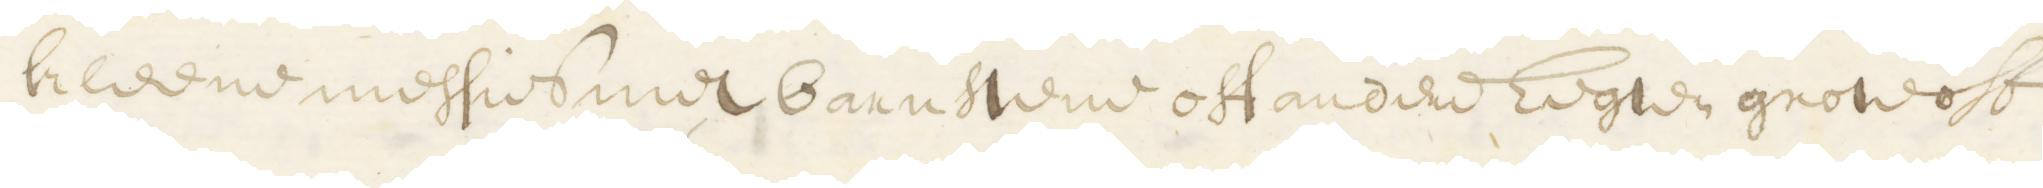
kleene messies met barnstene off andere hegten grote off
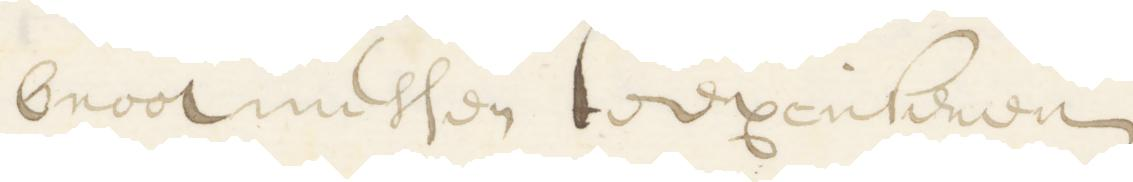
brootmessen te excuseren
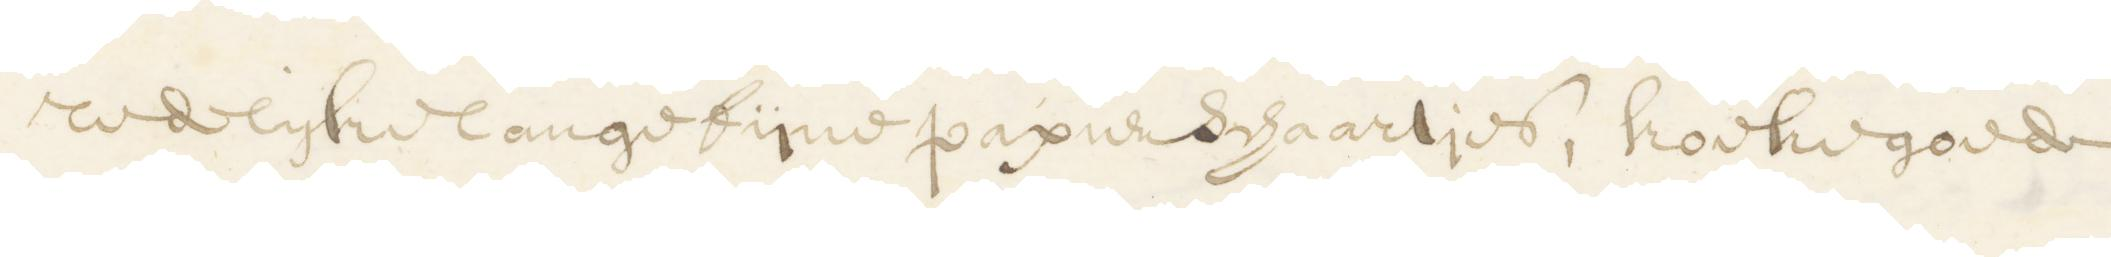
redelijke lange fijne papierschaartjes, koeke goede
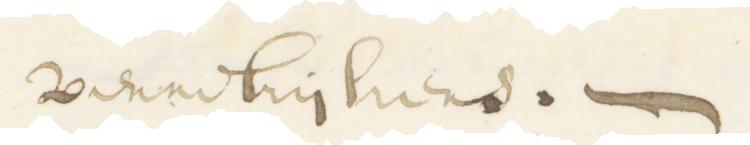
verrekijkers. —
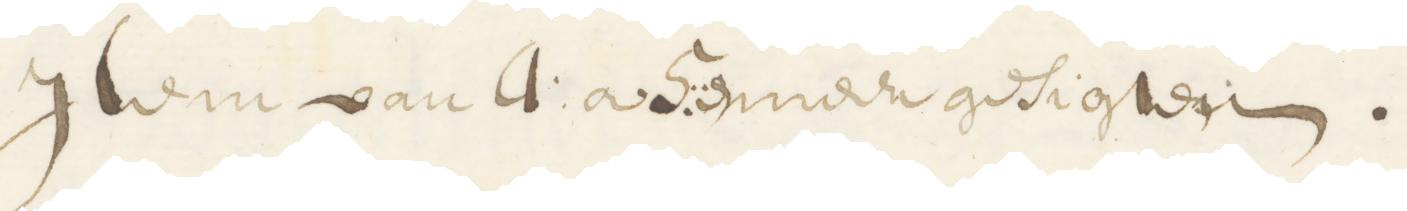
Jtem van 4: a 5: en meer gesigten.
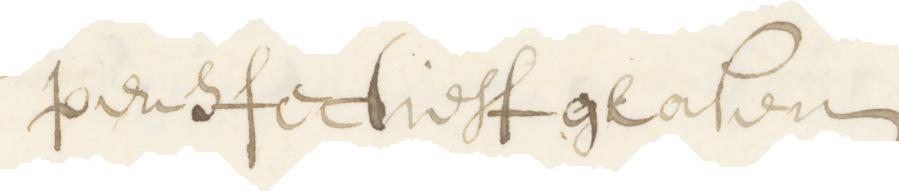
persfectieff glasen
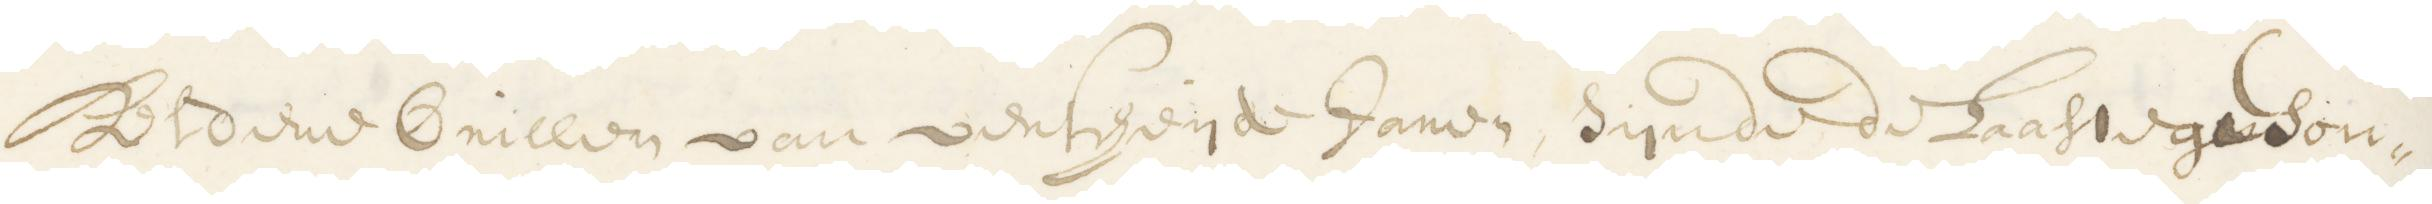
Heldere brillen van verscheijde Jaren, sijnde de laaste geson„
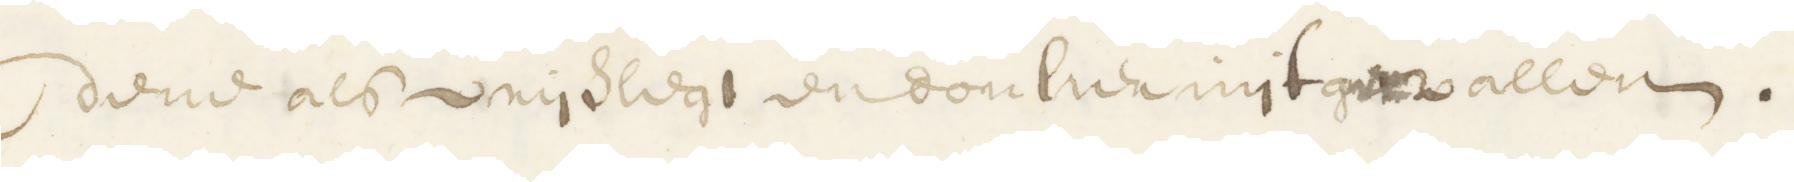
dene als vrij slegt en donker uijtgevallen.
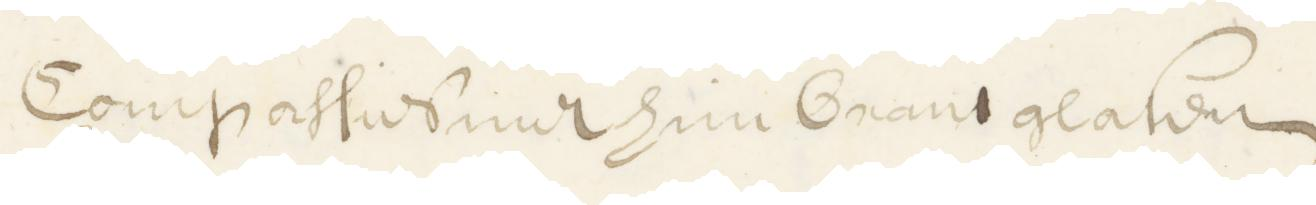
Compassies met hun brant glasen
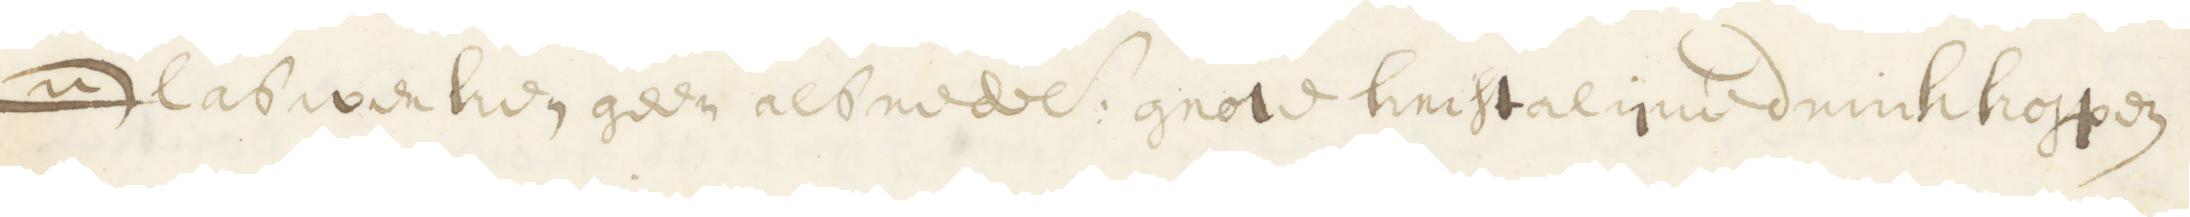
Glaswerken geen als redelijk grote kristalijne drinkkoppen
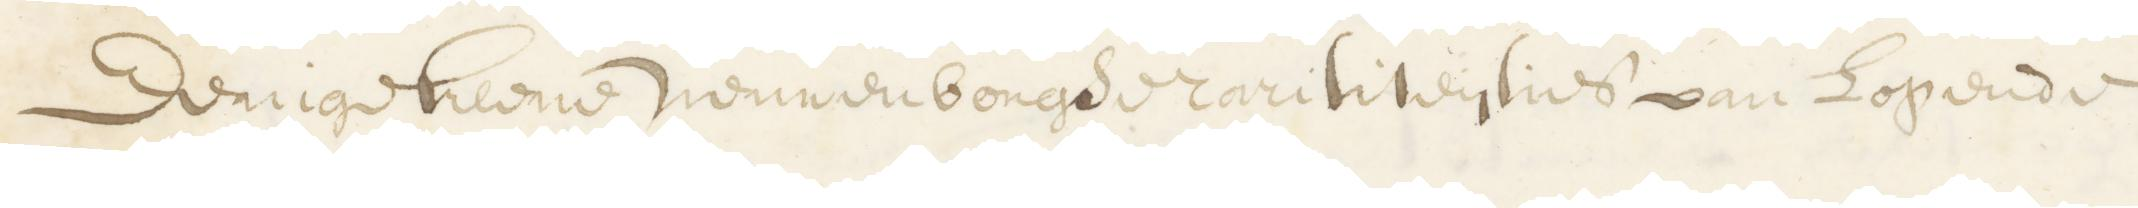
Eenige klene neurenborgse rarititeijties van lopende
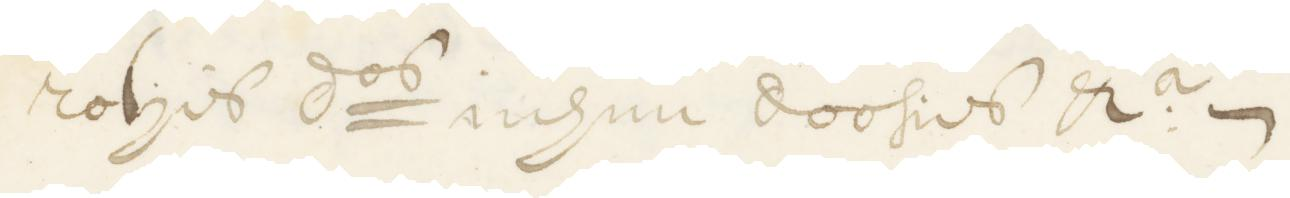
rotjes d=os in hun doosies &:a —
